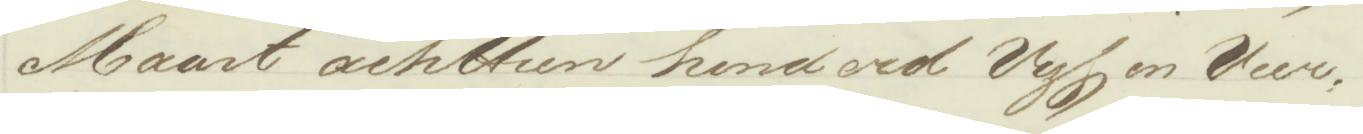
Maart achttien honderd Vyf en Veer„
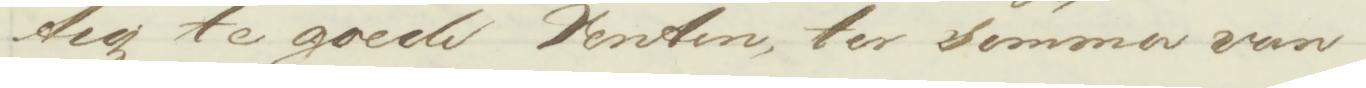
tig te goede Venten, ter somma van
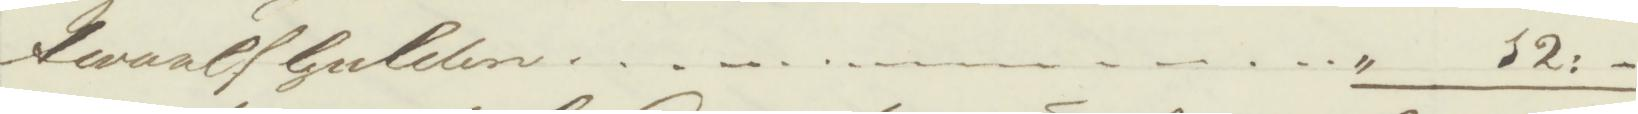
twaalf Gulden . . . . . . . . . . . . . . . . . . . „ 12: —
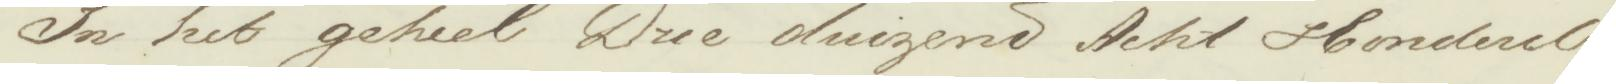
In het geheel Drie duizend Acht Honderd
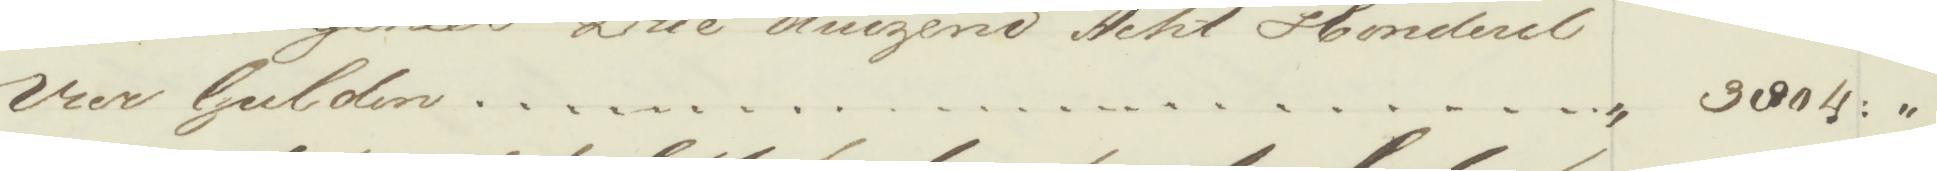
Vier Gulden . . . . . . . . . . . . . . . . . . . . . . . . . „ 3804: „
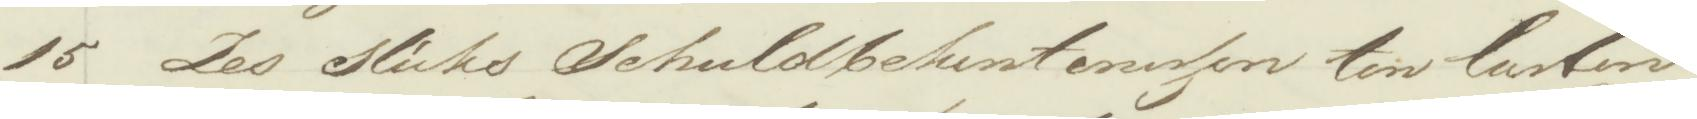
15 Zes stuks Schuldbekentenissen ten lasten
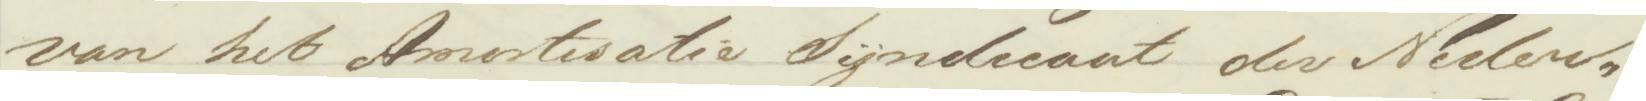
van het Amortisatie Sijndicaat der Neder„
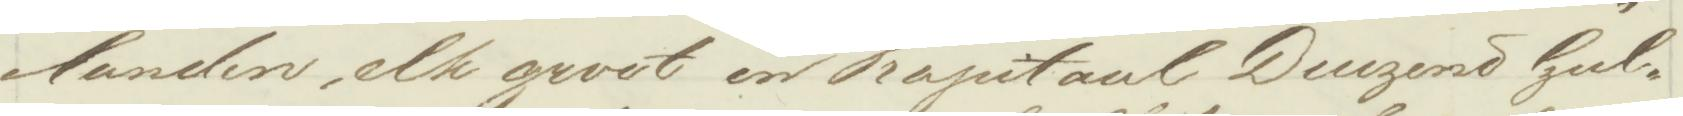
,landen, elk groot in Kapitaal Duizend Gul„
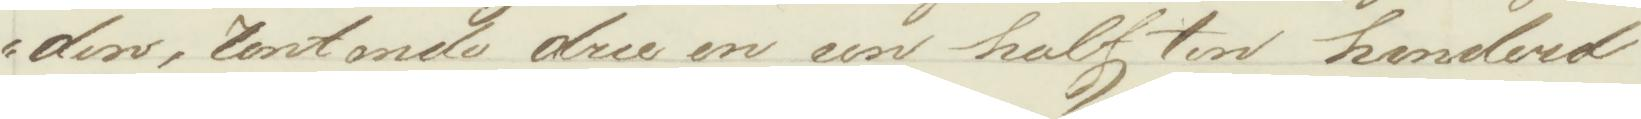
„den, rentende drie en een half ten honderd
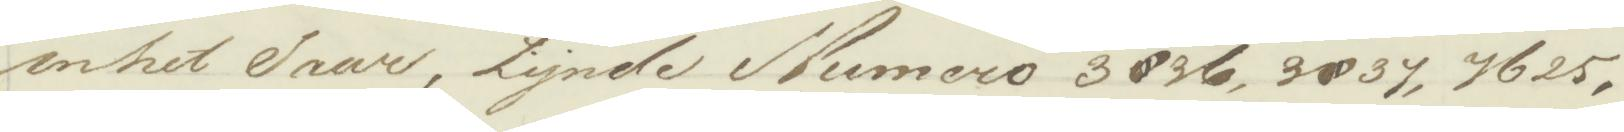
in het Iaar, zijnde Numero 3836, 3837, 7625,
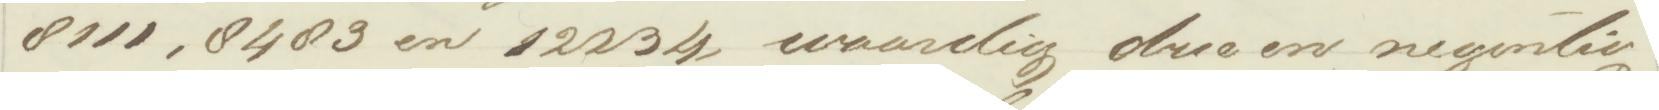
8111, 8483 en 12234, waardig drie en negentig
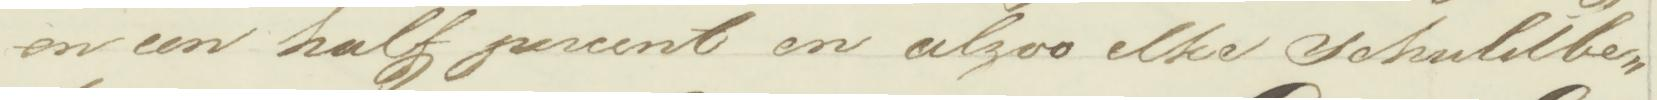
en een half percent en alzoo elke schuldbe„
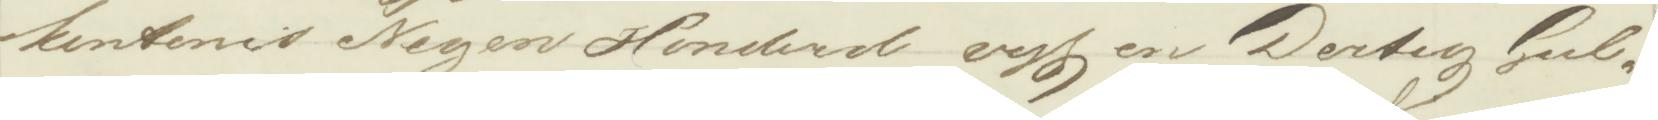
kentenis Negen Honderd vyf en Dertig Gul„
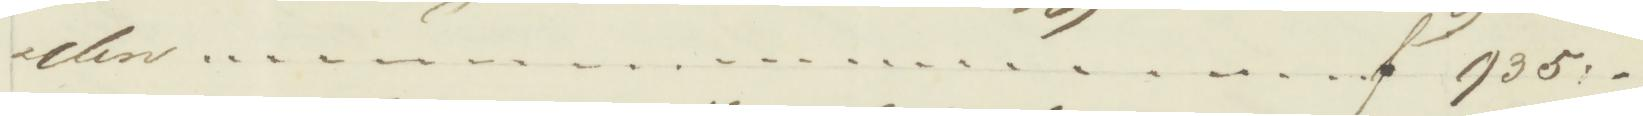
den . . . . . . . . . . . . . . . . . . . . . . . . . . ƒ 935: -
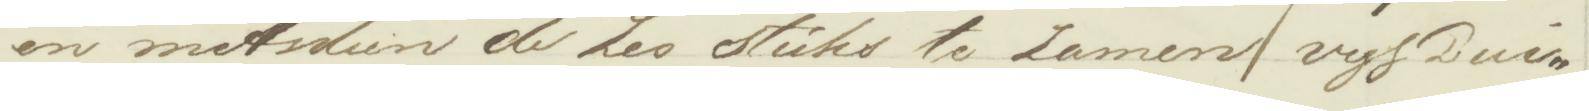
en mitsdien de zes stuks te zamen vyf Dui
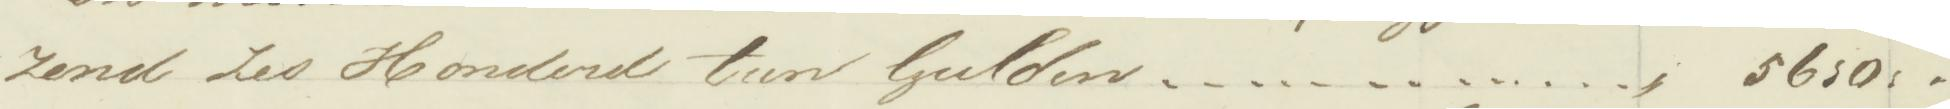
zend zes Honderd tien Gulden . - . . . . . . . . . . . „ 5610:
